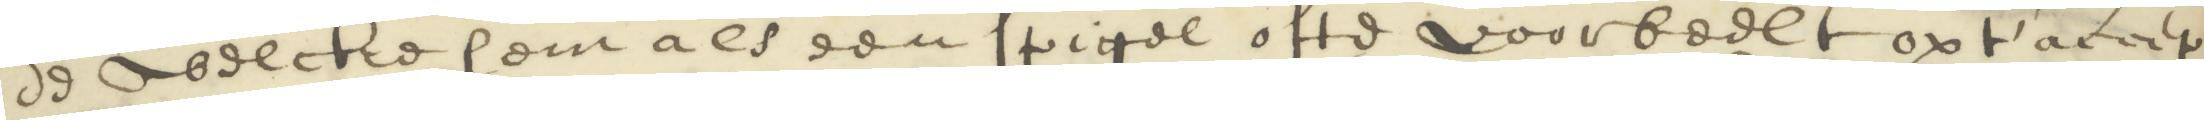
de welcke som als een spigel ofte voorbeelt op t' accep
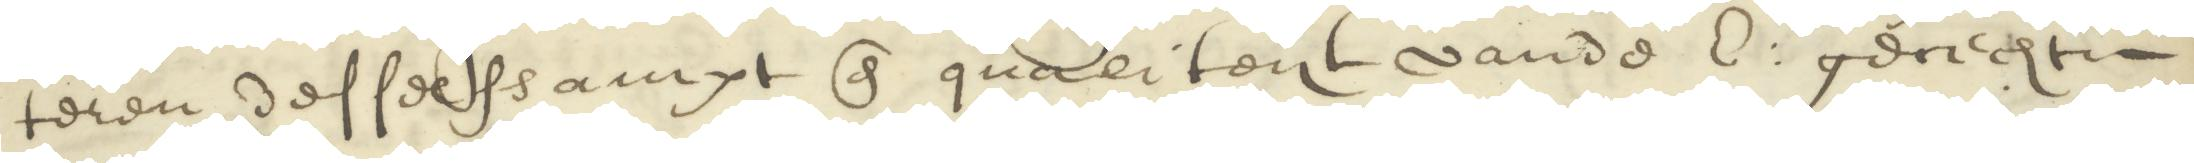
teren desselfs ampt ende qualiteyt vande E: gerechte
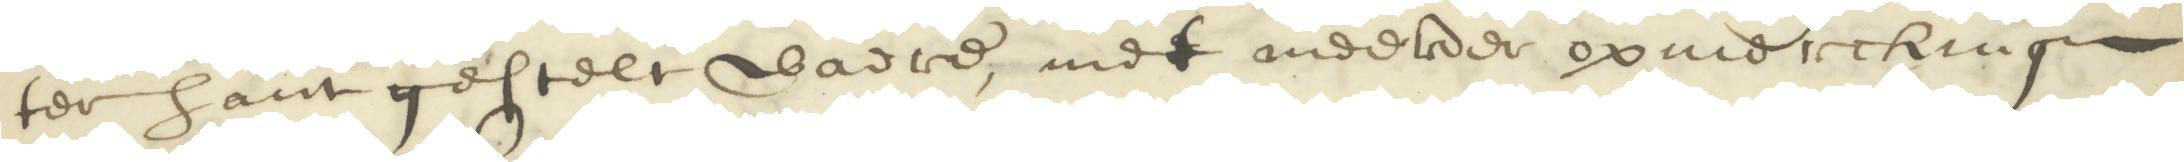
ter hant gestelt waere, met meerder opmerckinge
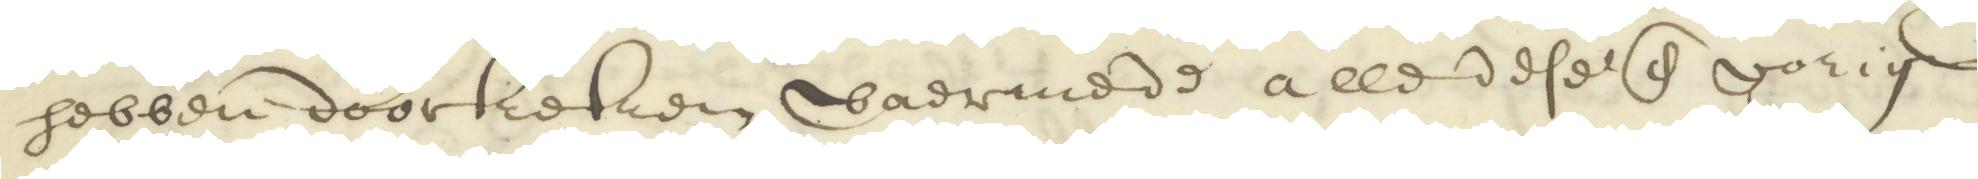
hebben doorkeken waermede alle dese ende vorige
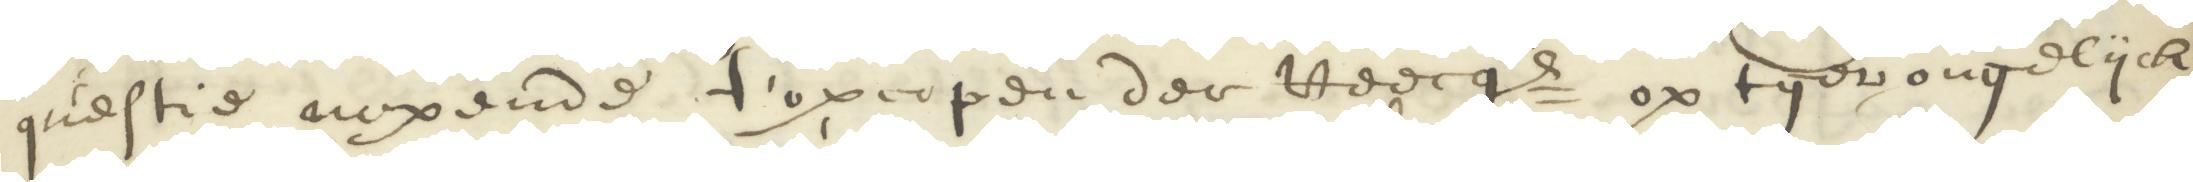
questie nopende t' opcopen der Reecq=e op tijdt ongelijck
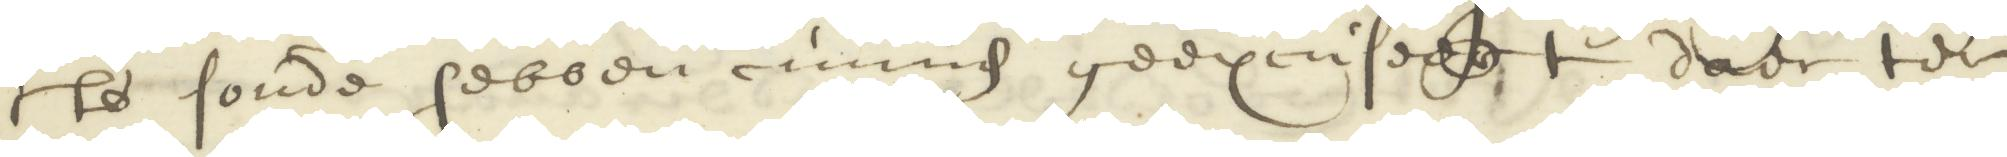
ste soude hebben cunnen geexcuseert daer ter
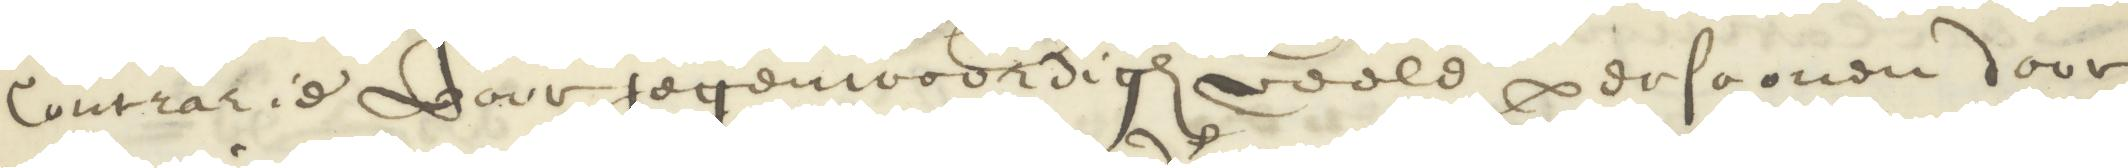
contrarie voor jegenwoordigh veele persoonen door
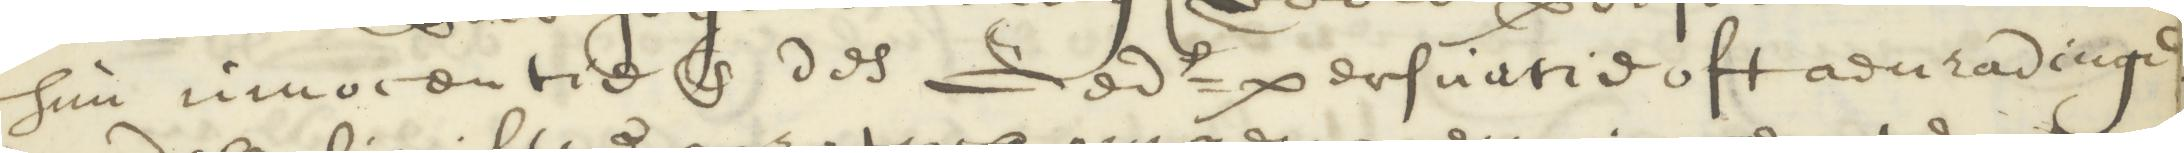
hun innocentie en des Ged=e persuatie oft aenradinge
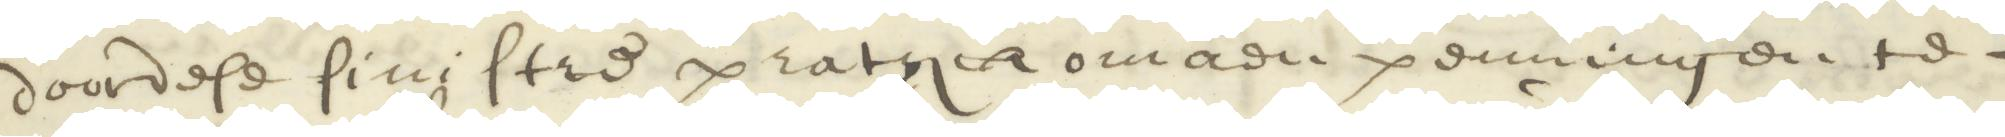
door dese sinistre pratyck om aen penningen te
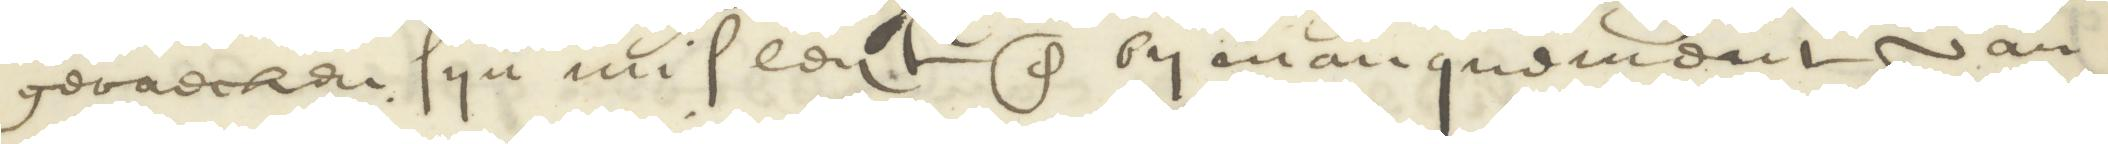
geraecken syn misleyt en by manquement van
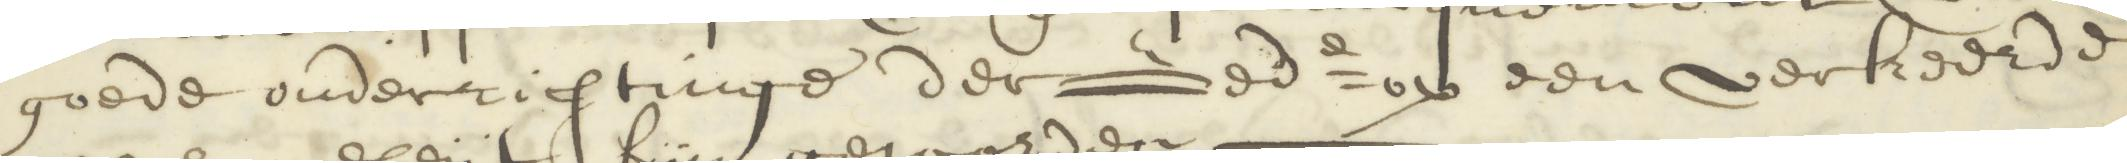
goede onderrichtinge der Ged=e op een verkeerde
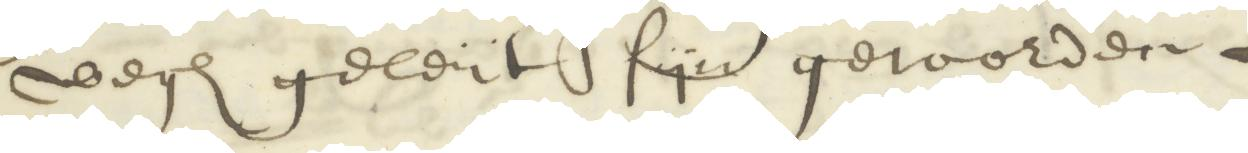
wegh geleijt sijn geworden
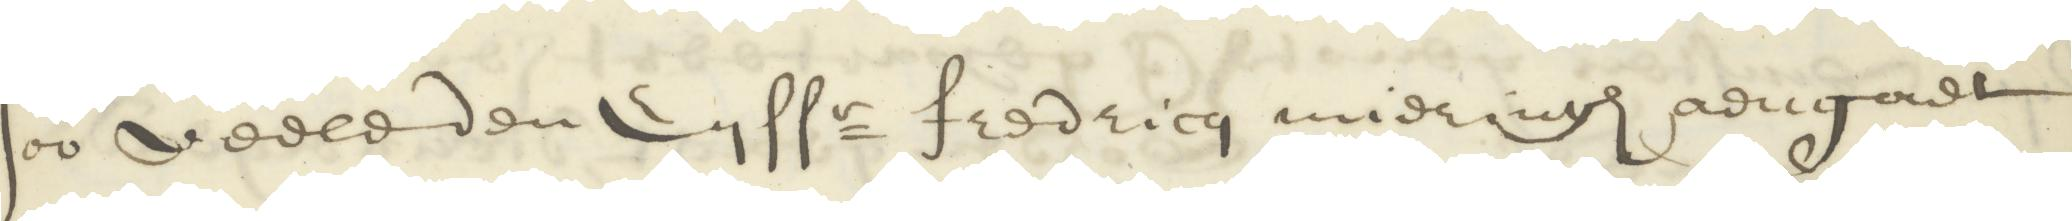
Soo veele den Eyss=r fredricq mieringh aengaet
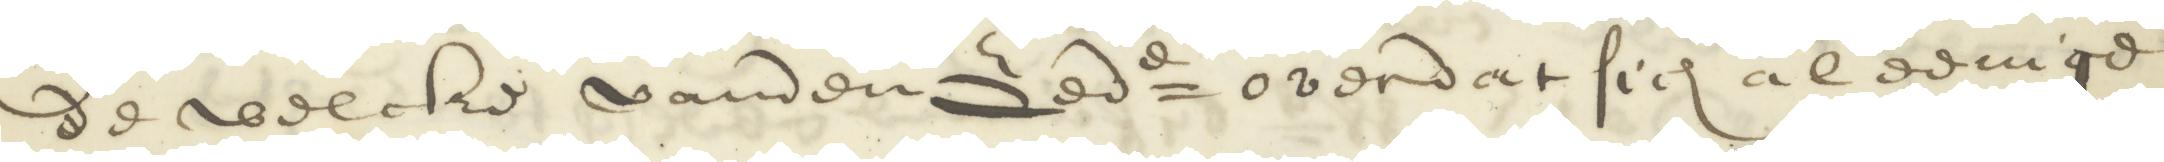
de welcke vanden Ged=e over dat sichal eenige
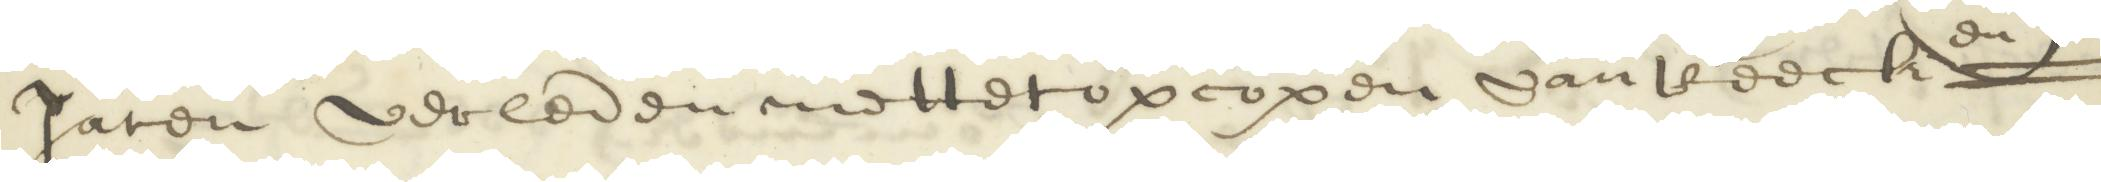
Jaren verleden mettet opcopen van reeck=en
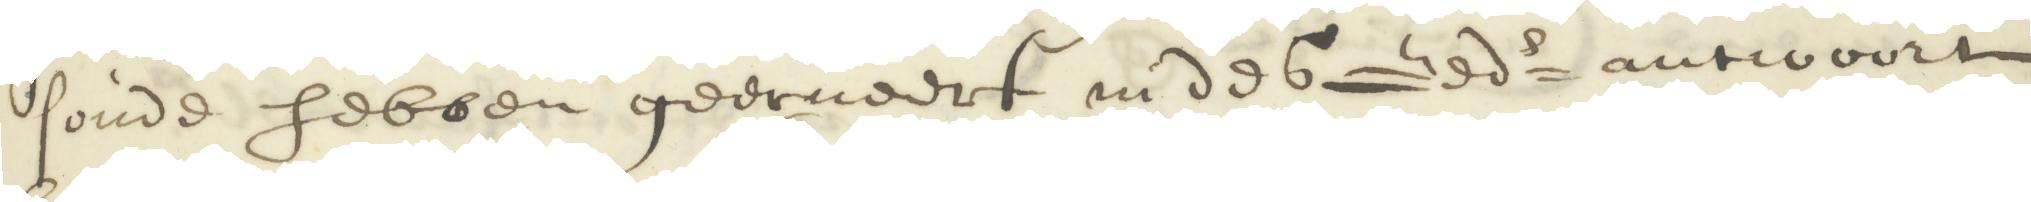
soude hebben geerneert in des Ged=e antwoort
